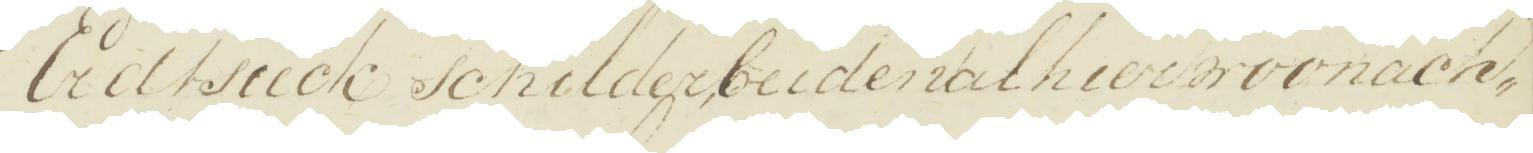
Erdtsieck schilder beiden alhier woonach„
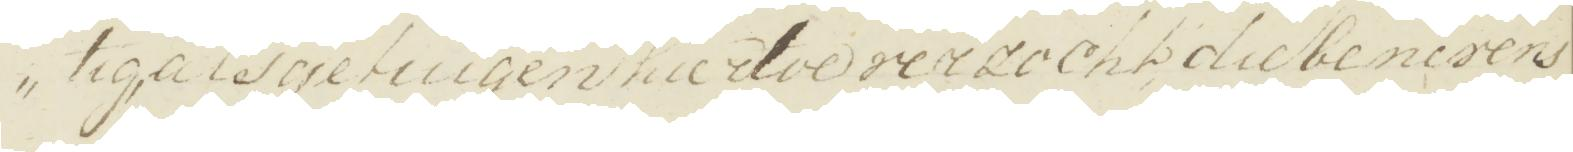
„tig, als getuigen hiertoe verzocht, die benevens
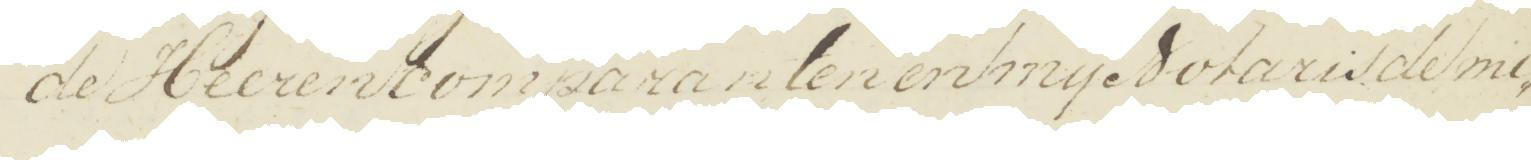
de Heeren Comparanten en my Notaris de mi
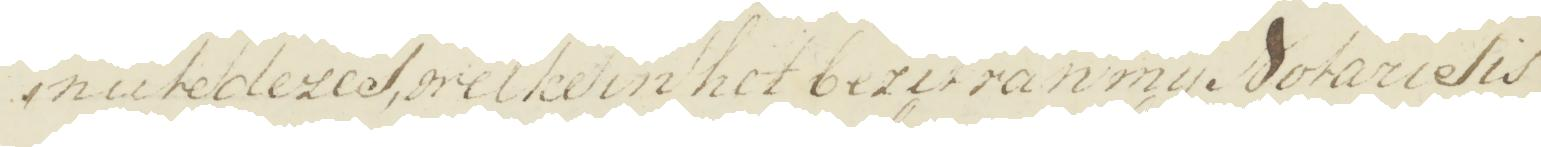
„nute dezes, welke in het bezit van my Notaris is
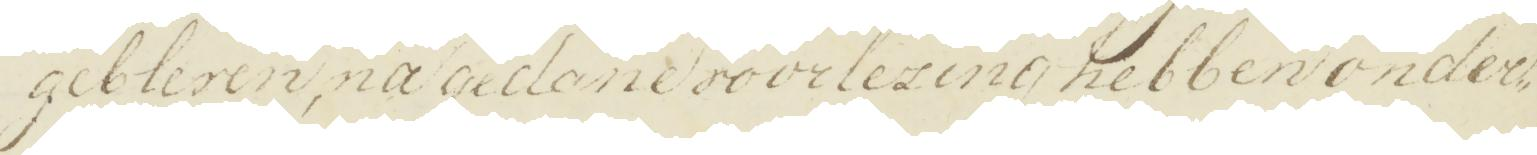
gebleven, na gedane voorlezing hebben onder„
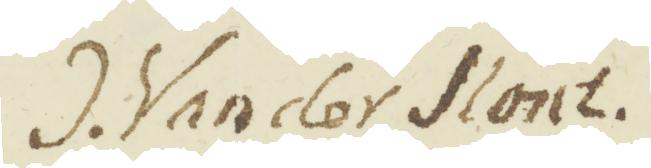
I. Van der slout.
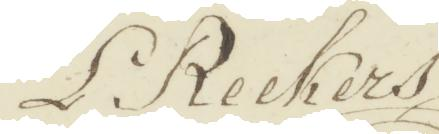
L Reekers
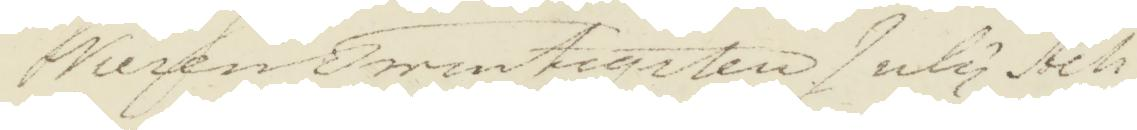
Vieren Twintigsten Julij Ach
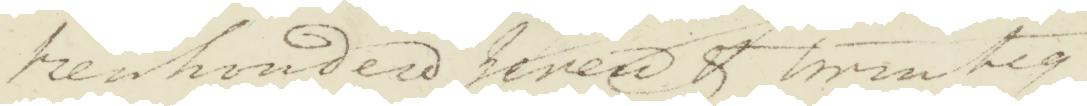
tienhonderd zeven & twintig
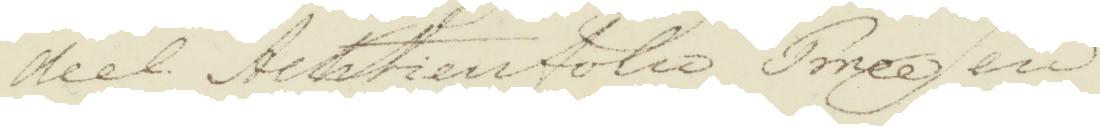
deel. Achtien folio Twee en
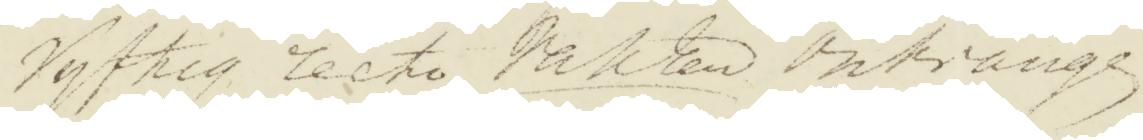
Vyftig recto vak Een ontvangen
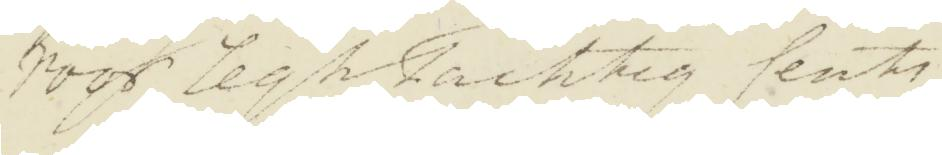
voor regt Tachtig Cents
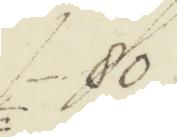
ƒ. 80
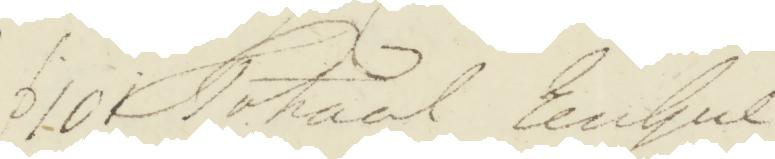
ƒ 101 Totaal EenGul
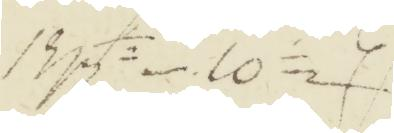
13 /c=t —.10½
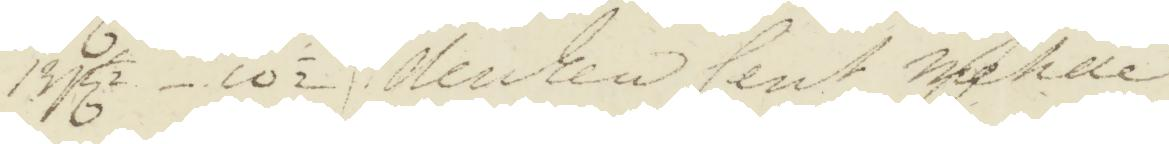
13 /c=t -.10½ den Een Cent makde
